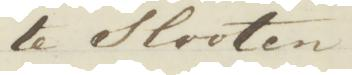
te slooten
